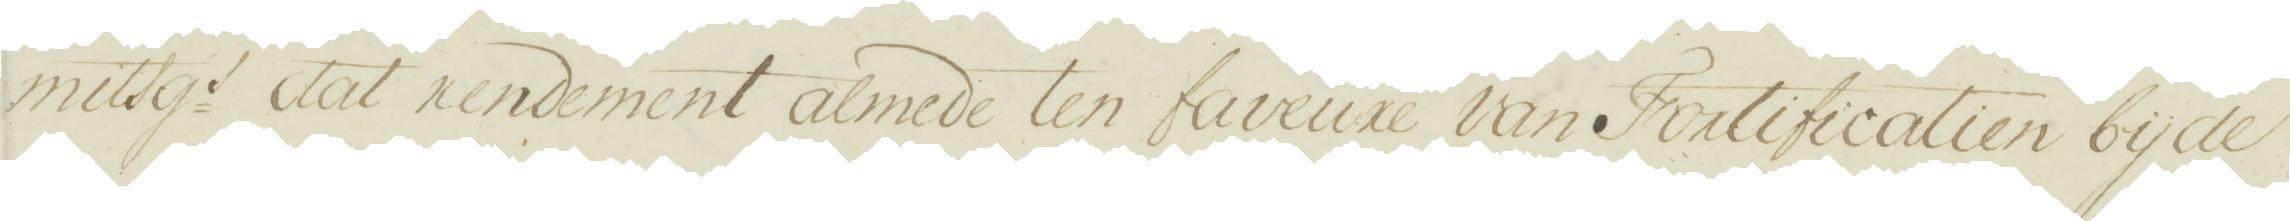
mitsg=s dat rendement almede ten faveure van Fortificatien bij de
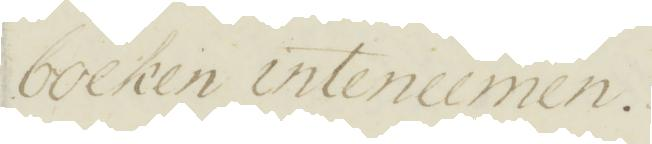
boeken inteneemen.
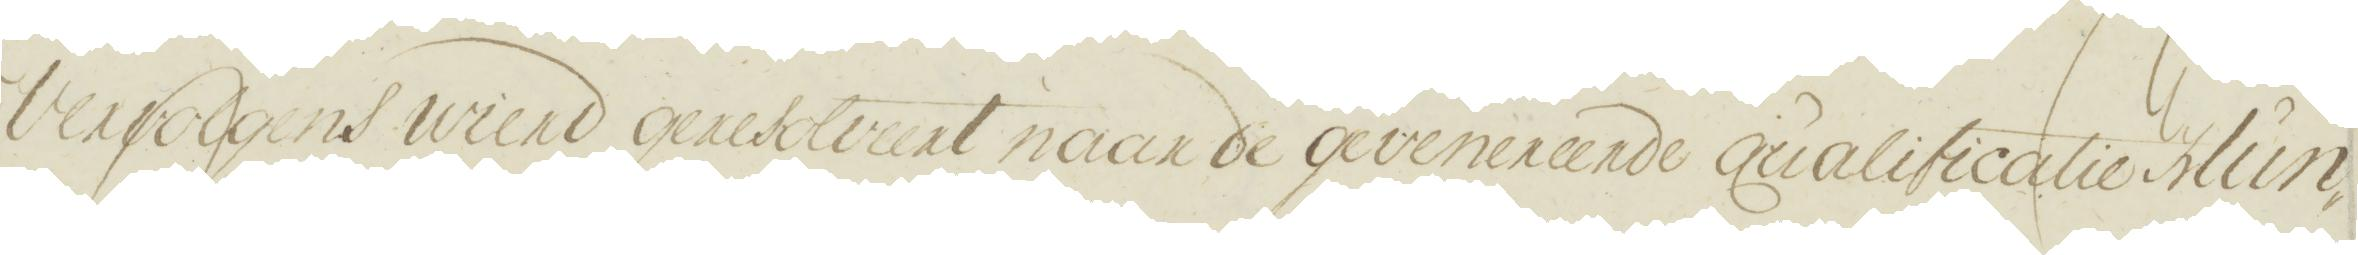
Vervolgens wierd geresolveert naar de gevenereerde qualificatie Hun„
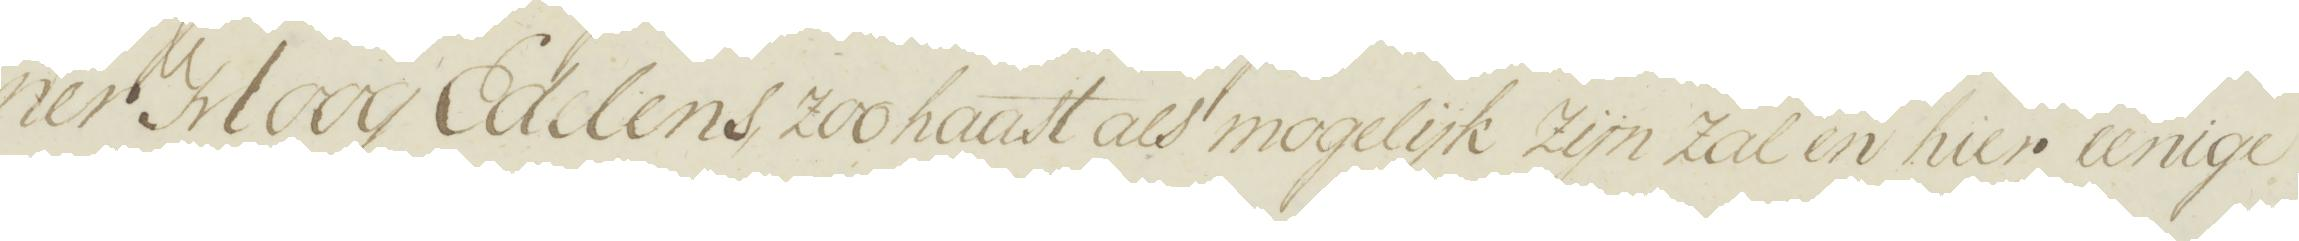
ner Hoog Edelens, zoo haast als mogelijk zijn zal en hier eenige
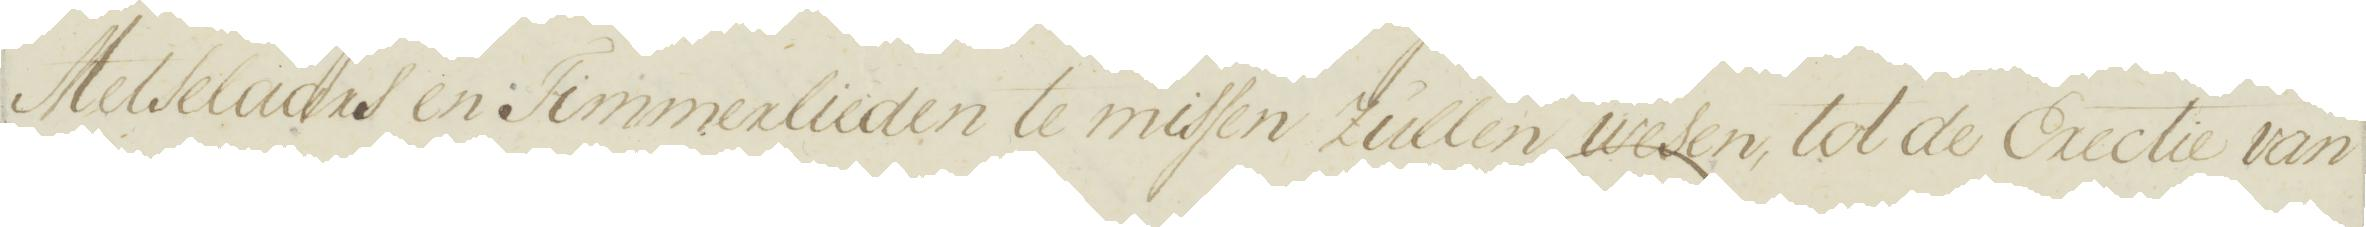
Metselaars en Timmerlieden te missen zullen wesen, tot de Erectie van
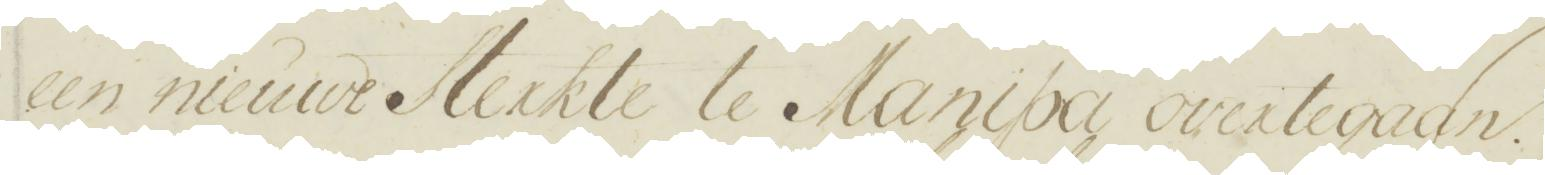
een nieuwe Sterkte te Manipa overtegaan.
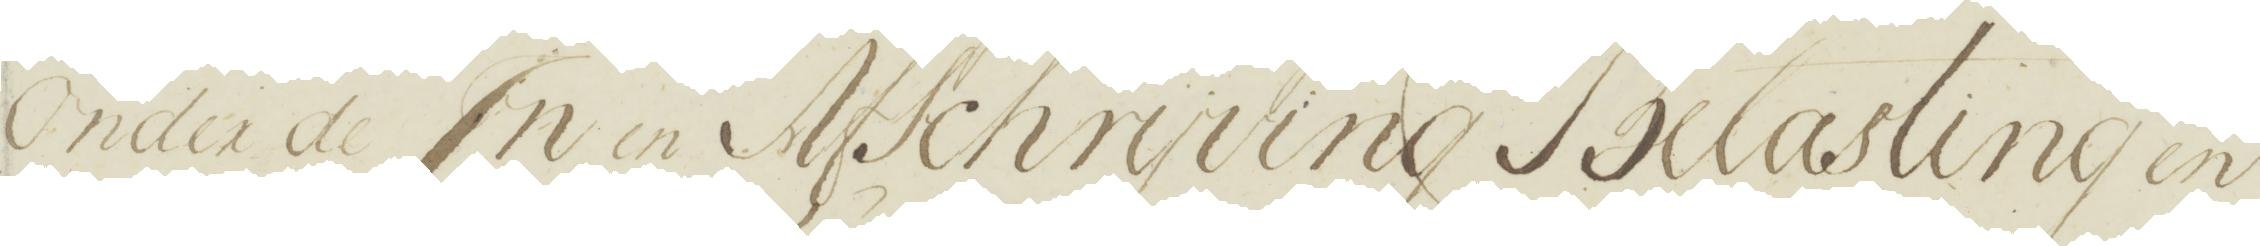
Onder de In en Afschrijving Belasting en
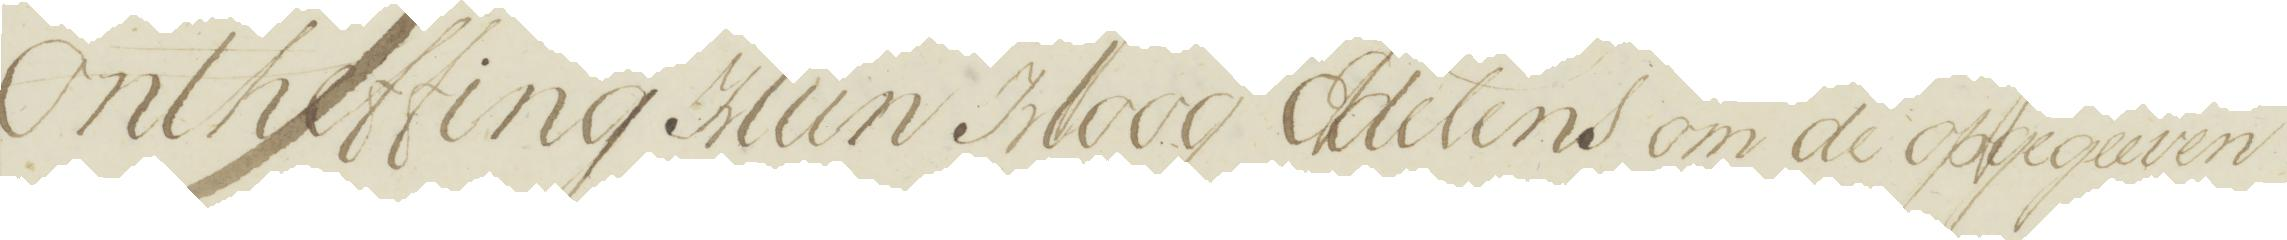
Ontheffing Hun Hoog Edelens om de opgegeeven
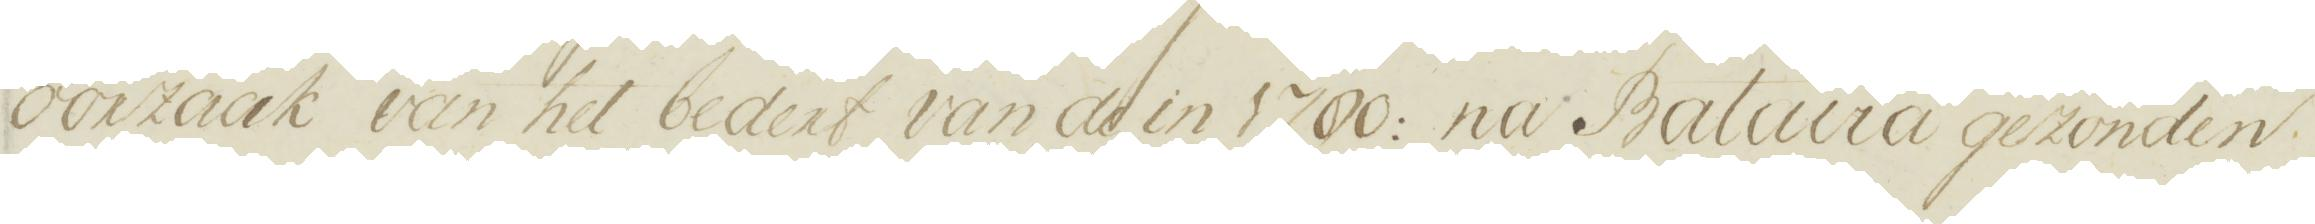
oorzaak van het bederf van de in 1780: na Batavia gezonden.
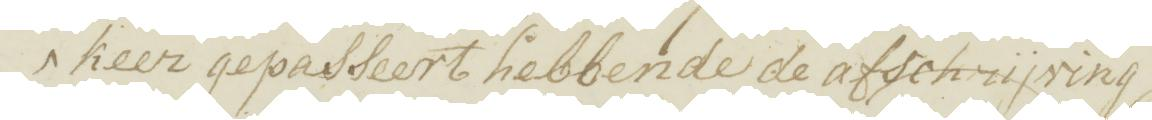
^keer gepasseert hebbende de afschrijving
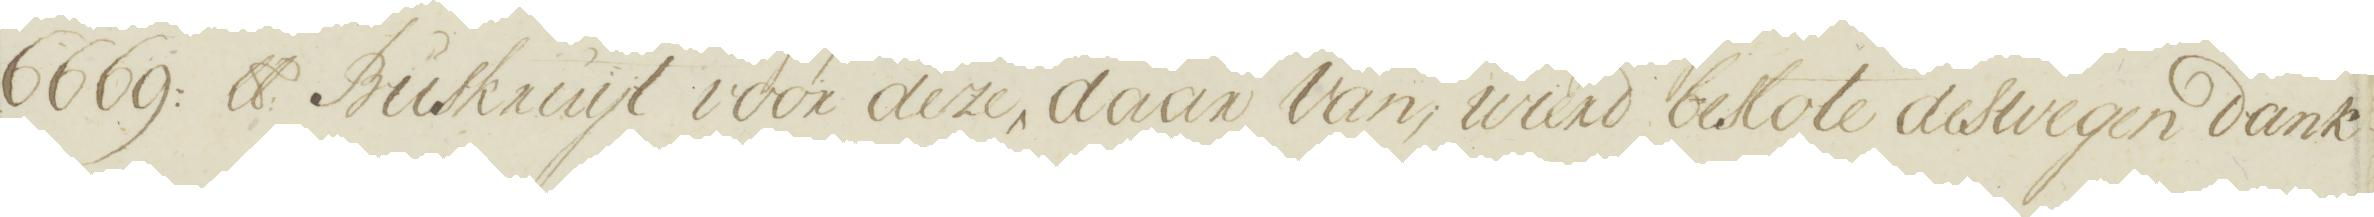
6669: lb: Buskruijt voor deze ^ daar van, wierd beslote deswegen dank
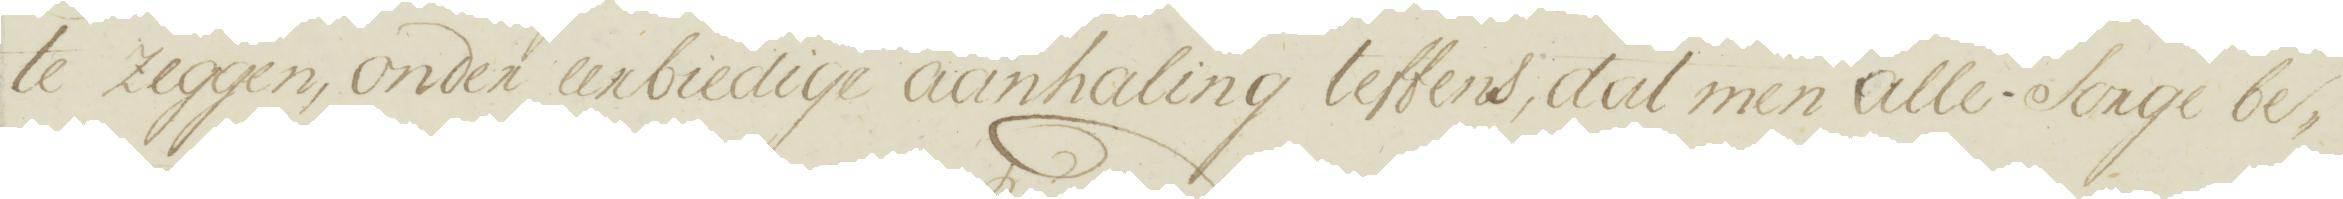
te zeggen, onder eerbiedige aanhaling teffens, dat men alle sorge be„
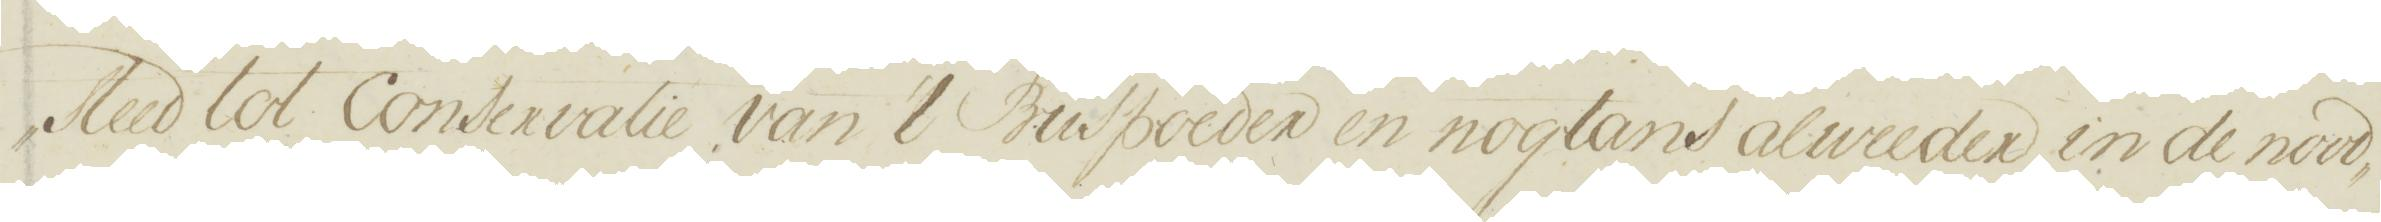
„steed tot conservatie van ’t Buspoeder en nogtans alweeder in de nood„
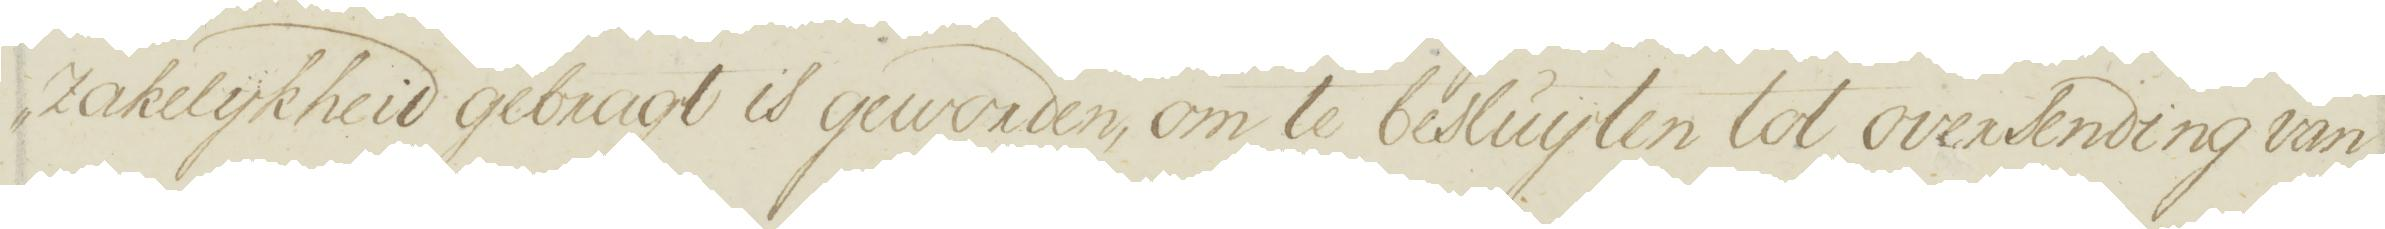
„zakelijkheid gebragt is geworden, om te besluijten tot oversending van
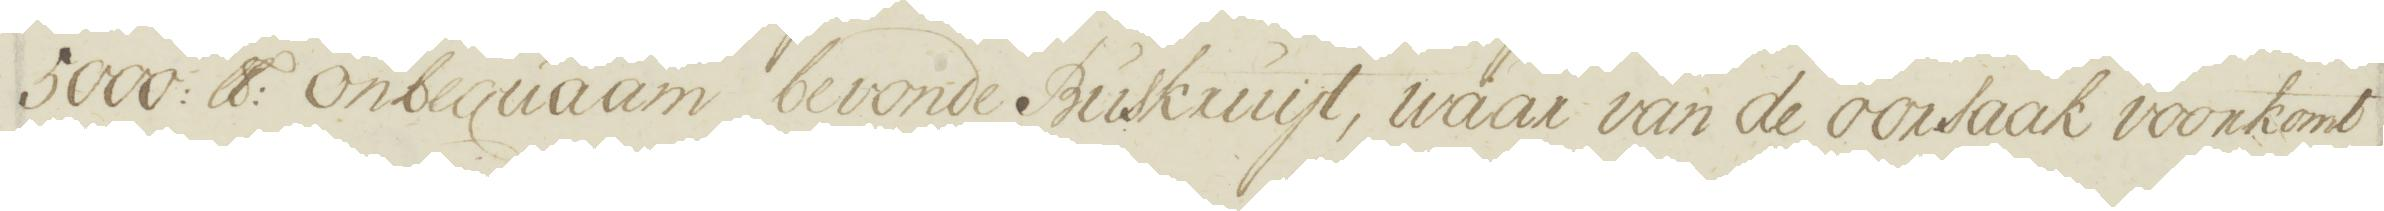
5000: lb: onbequaam bevonde Buskruijt, waar van de oorsaak voorkomt
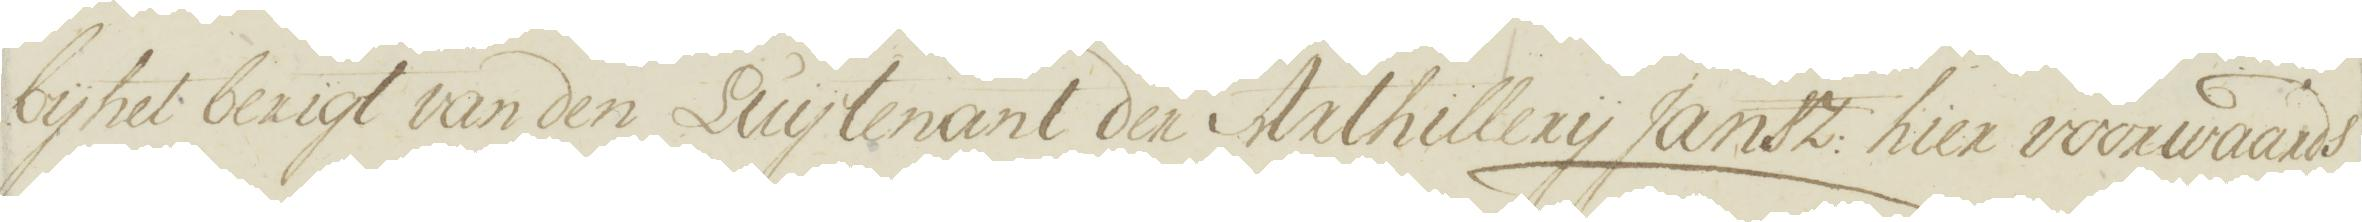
bij het berigt van den Luijtenant der Arthillerij Jansz: hier voorwaards
